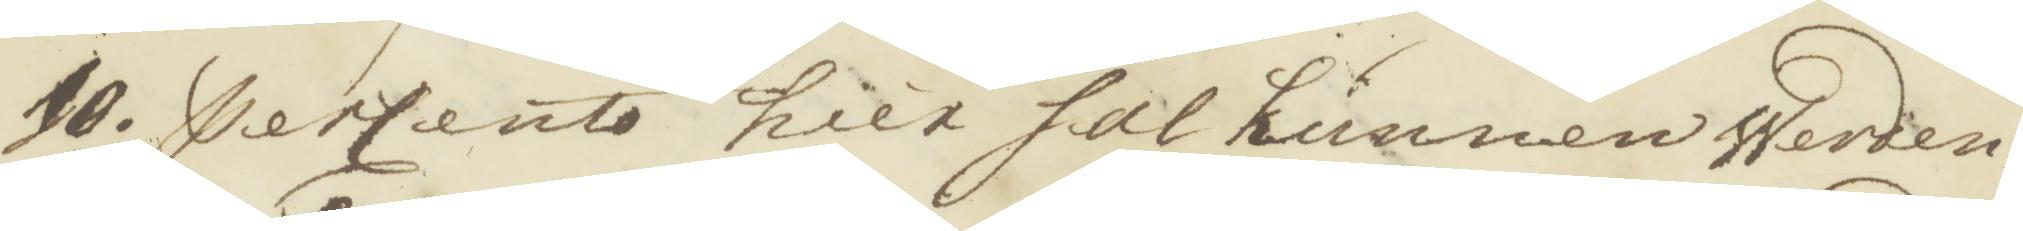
10. percents hier sal kunnen werden
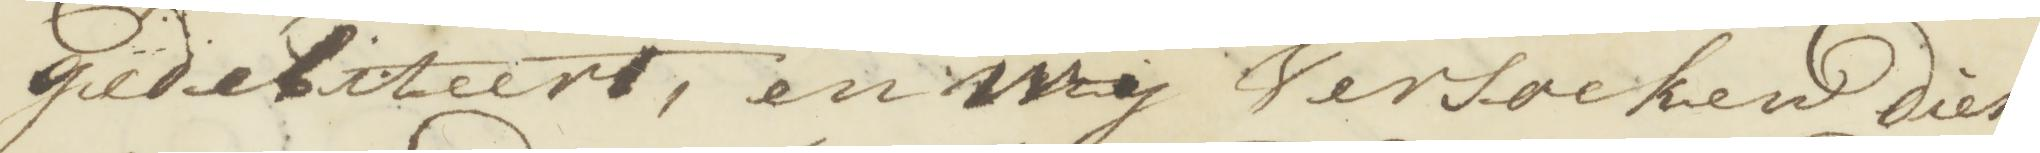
gedebiteert, en wij versoeken dier
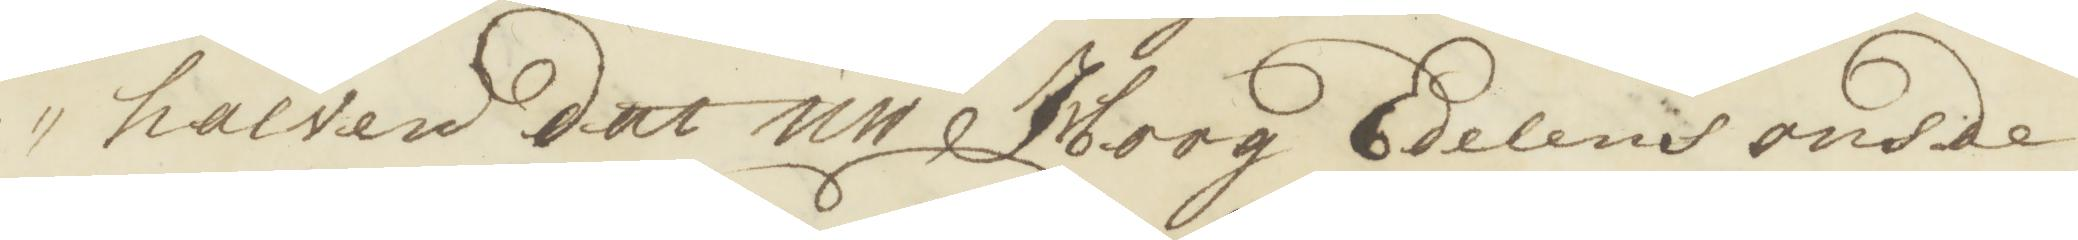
„halven dat uw Hoog Edelens ons de
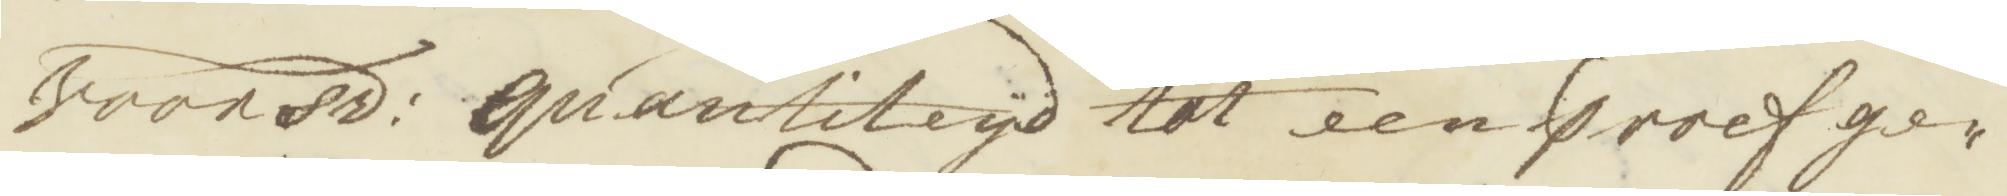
voorsz: quantiteijd tot een proefge„
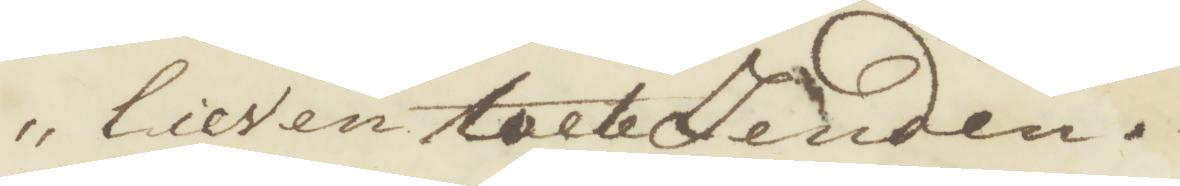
„lieven toetezenden.
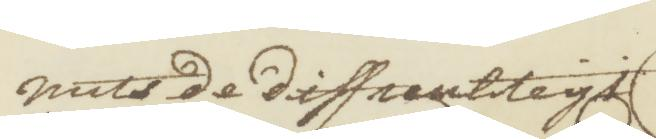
mits de difficulteijt
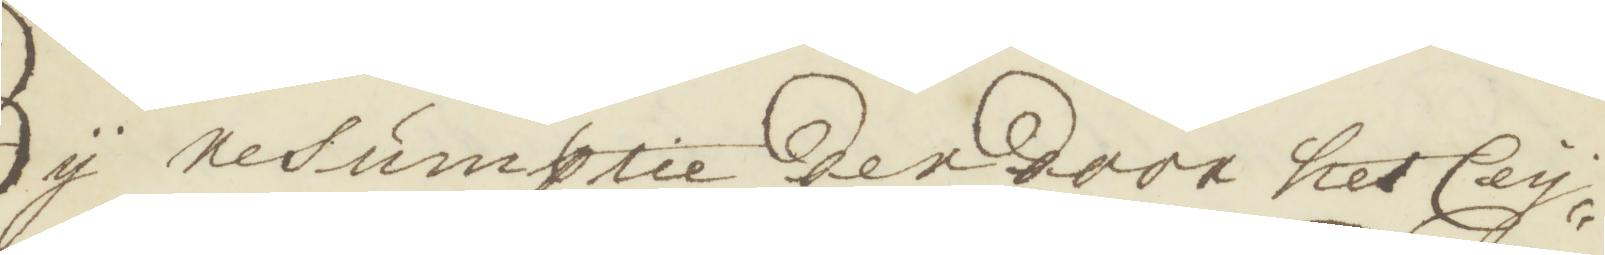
Bij resumptie der door het Ceij„
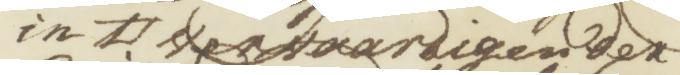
in ’t vervaardigen der
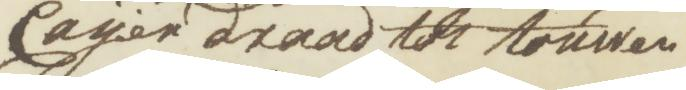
Caijer draad tot touwen
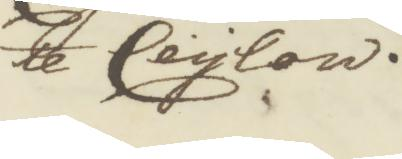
te Ceijlon.
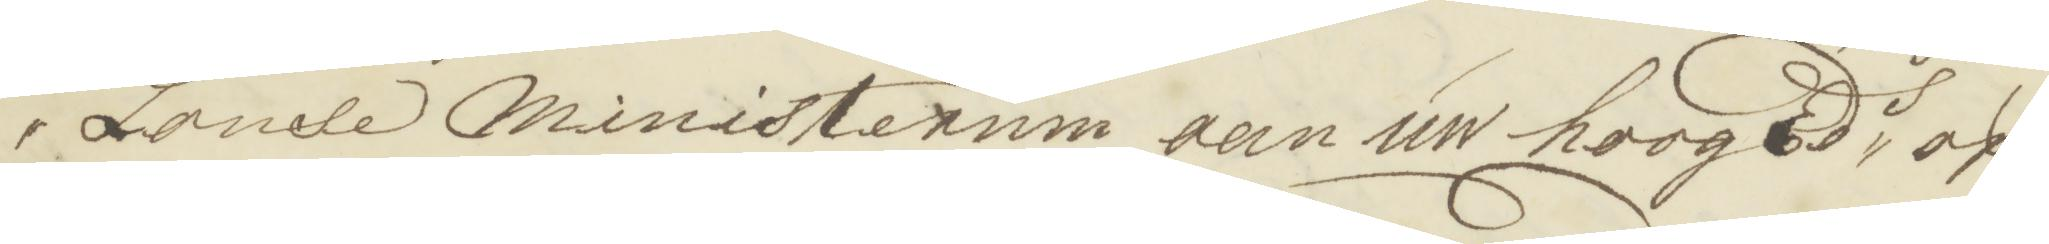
„Lonse ministerum aan uw hoog Ed„s op
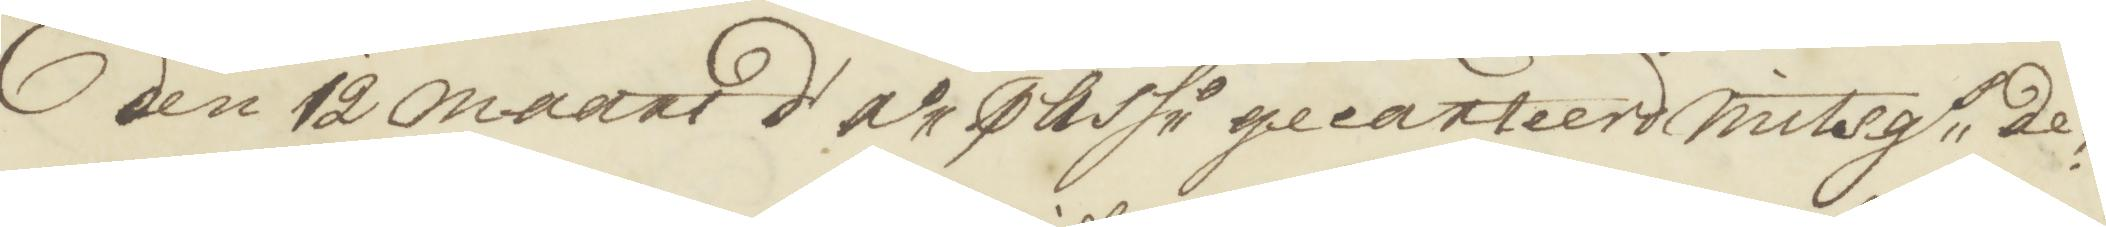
den 12 maart d’ a„o pass„o gecarteerd mitsg„s de„
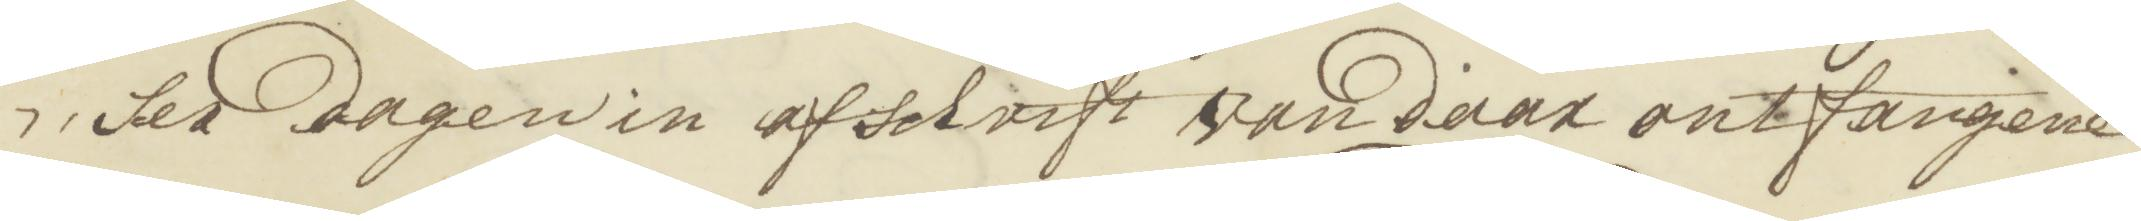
„ser dagen in afschrift van daar ontfangene
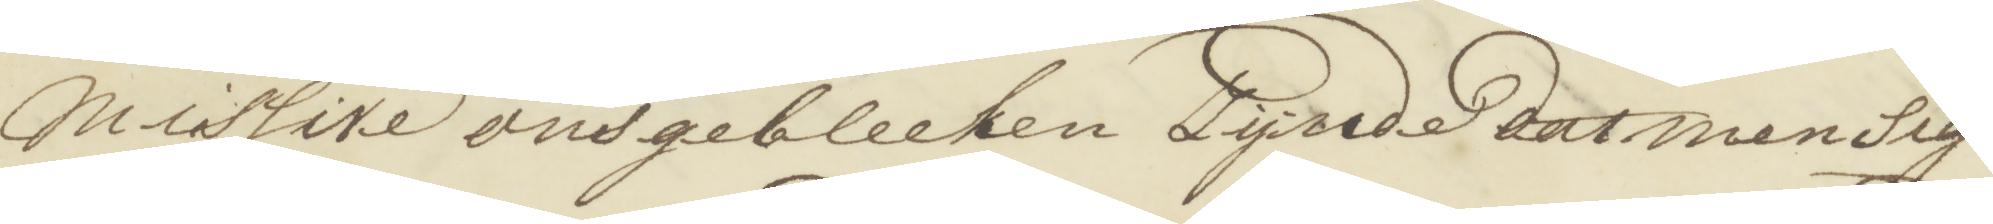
missive ons gebleeken zijnde dat men sig
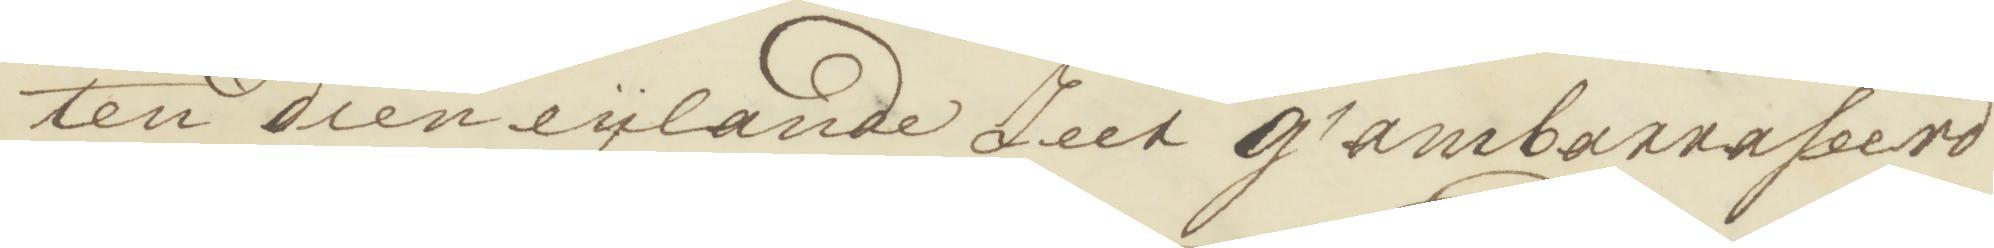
ten dien eijlande Zeer g’ambarraseerd
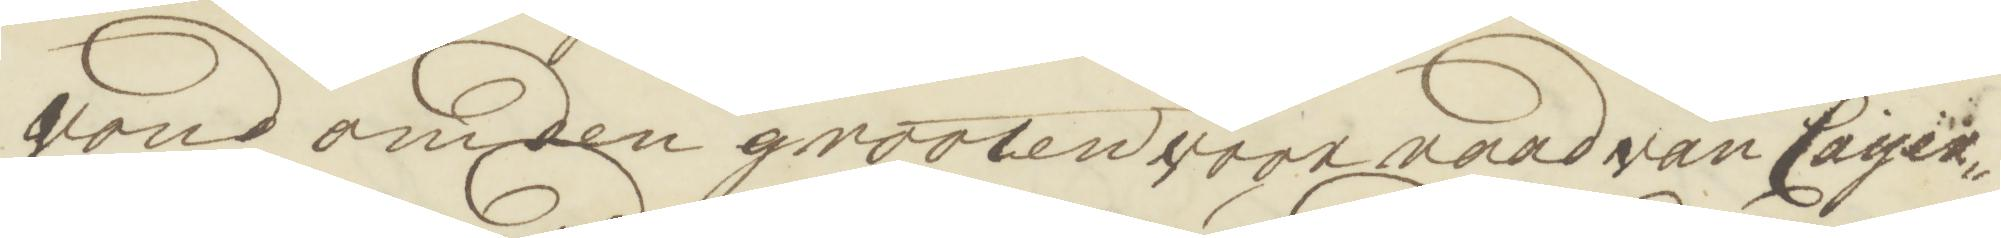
vond om den grooten voor raad van Caijer„
